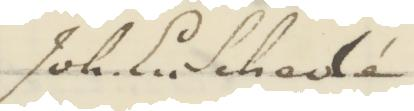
Joh. Enschedé
